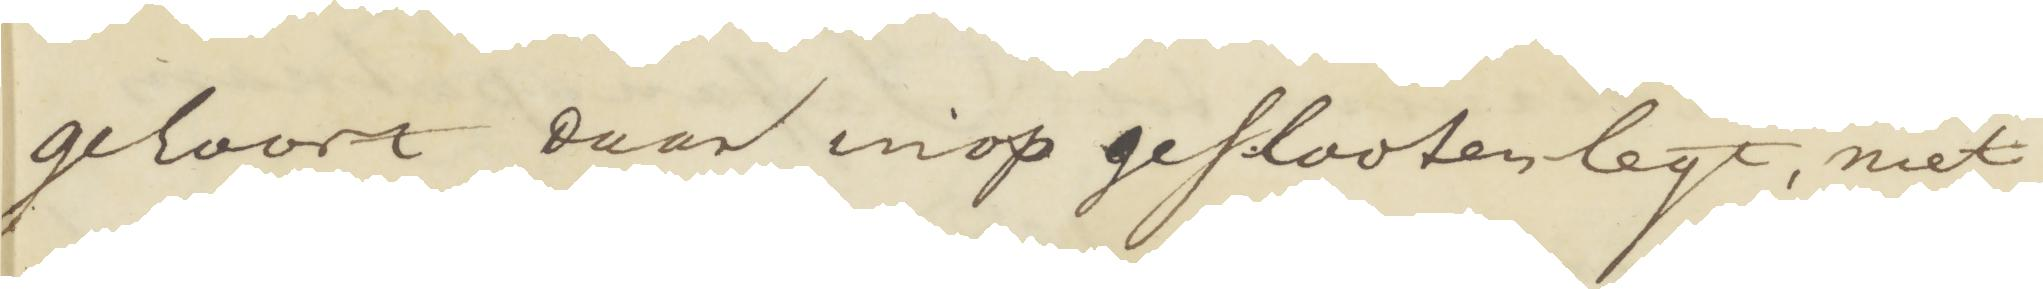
gehoort daar inop geslooten legt, niet
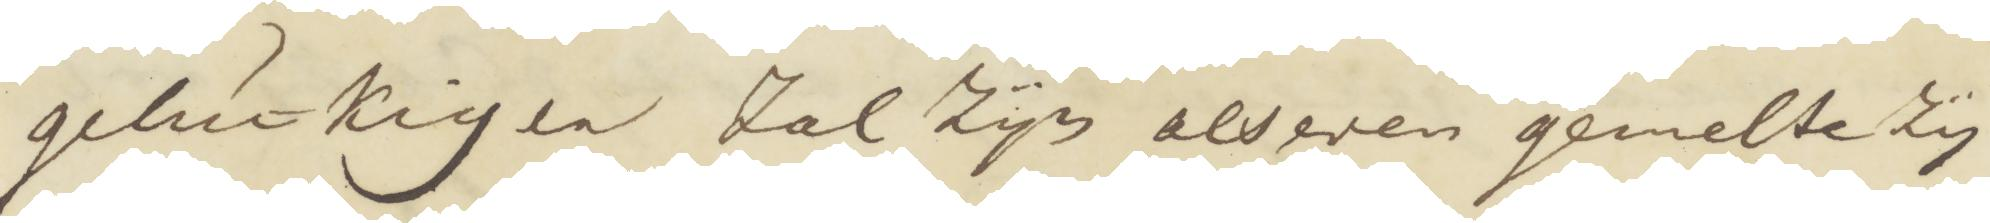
geluckigen zal zijn als even gemelte zij
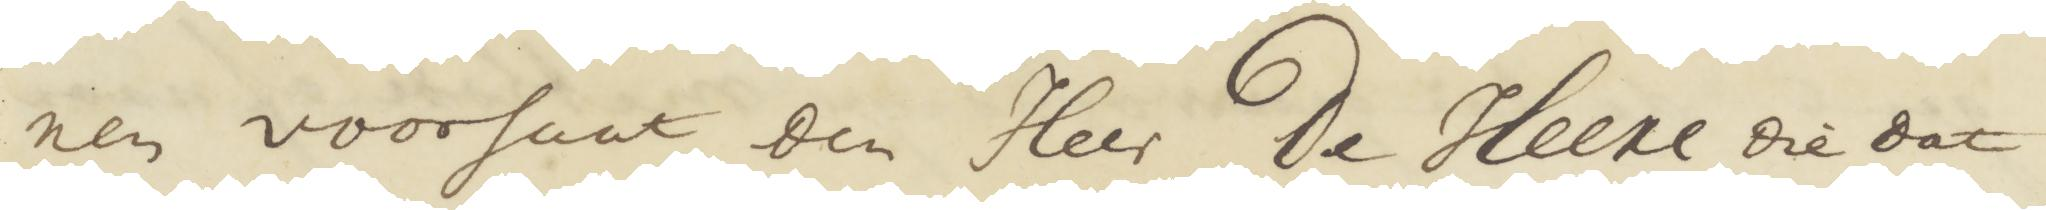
nen voorsaat den Heer de Heere die dat
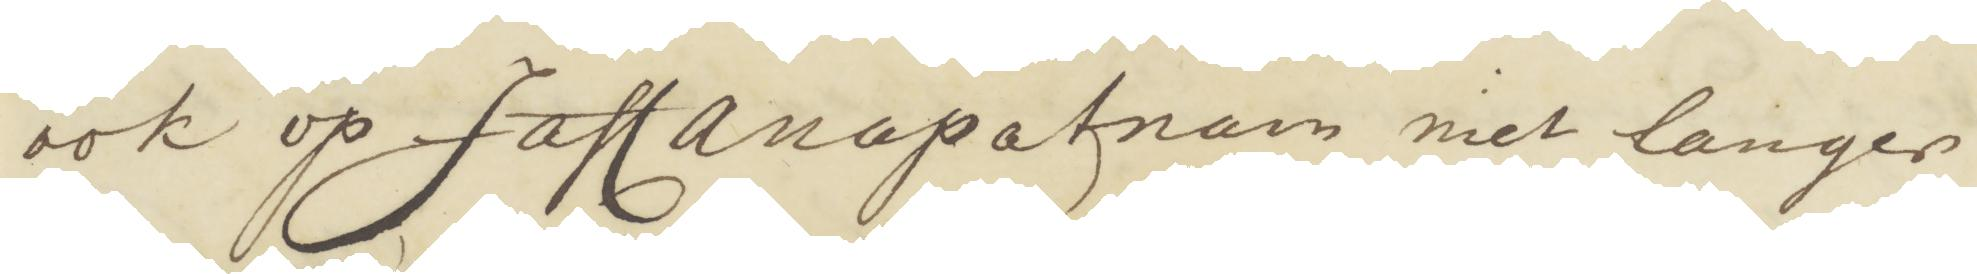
ook op Jascanapatnam niet langer
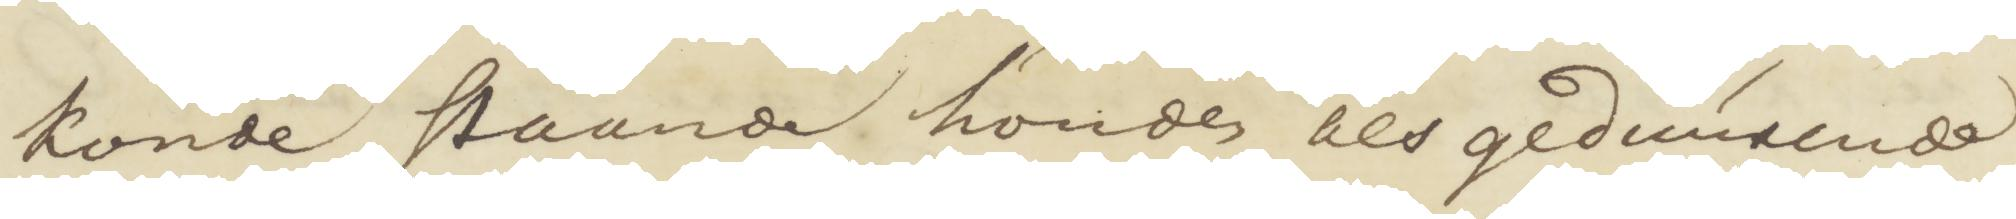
konde staande houden als geduurende
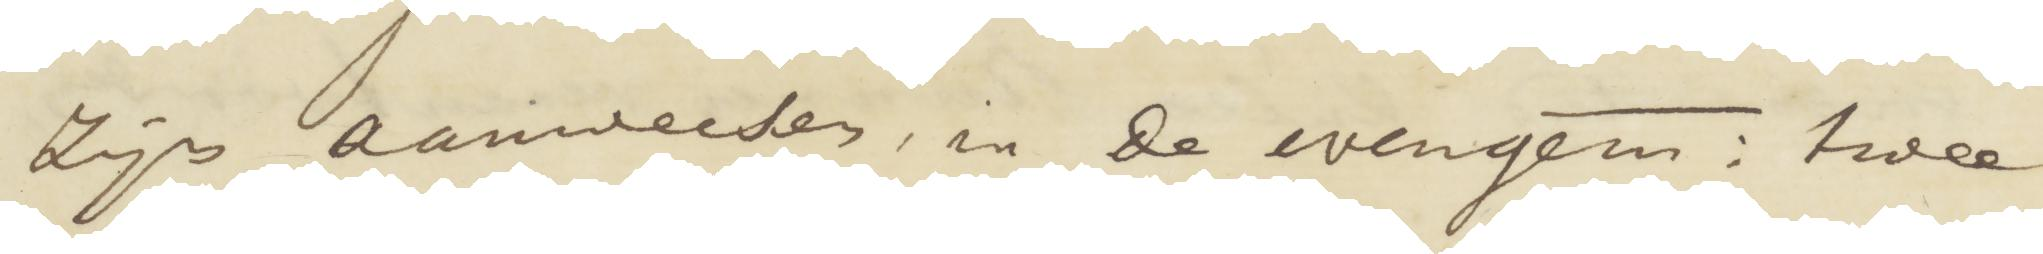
zijn aanweesen, in de evengem: twee
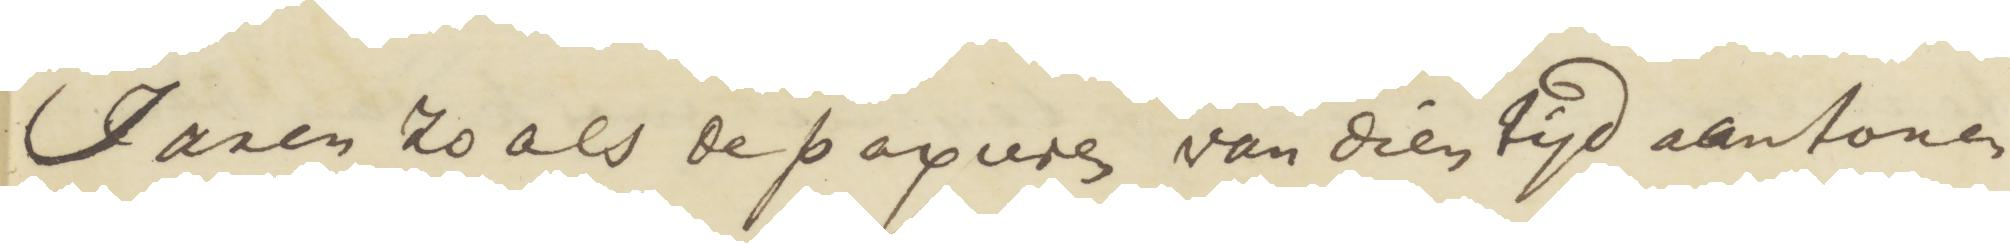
Iaren zo als de papieren van dien tijd aantonen
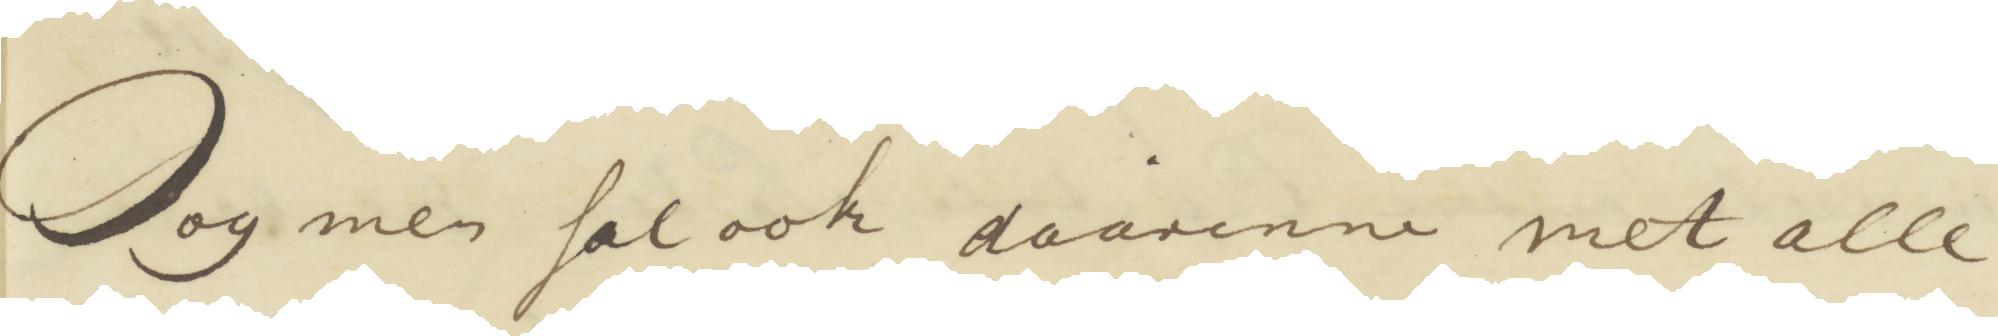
Dog men sal ook daarinne met alle
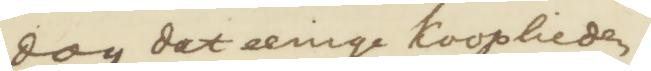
dog dat eenige kooplieden
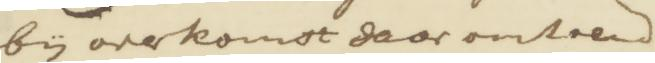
bij overkomst daar ontrend
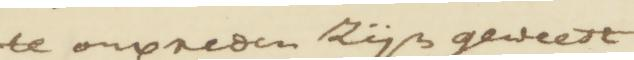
te onvreden zijn geweest
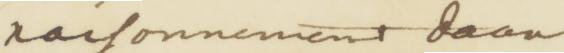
raisonnement daar
